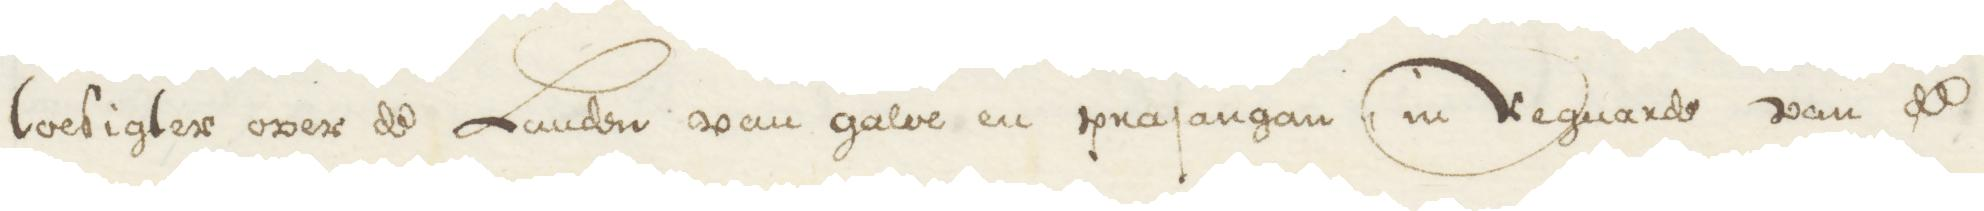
toesigter over de Landen van galve en prajangan, in reguarde van de
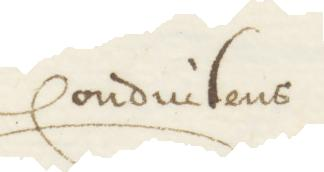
Conduitens
